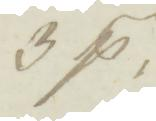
3 p,s
